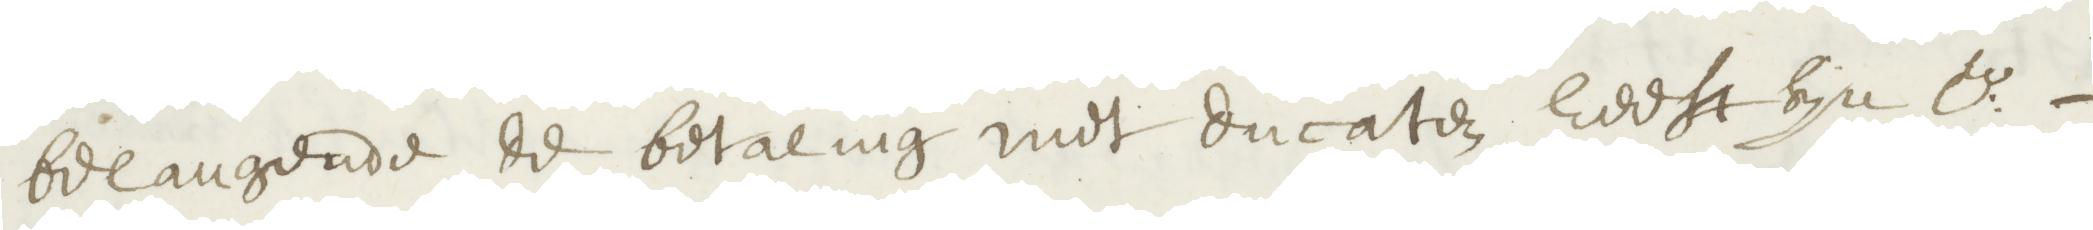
belangende de betaling met ducaten heeft sijn E: —
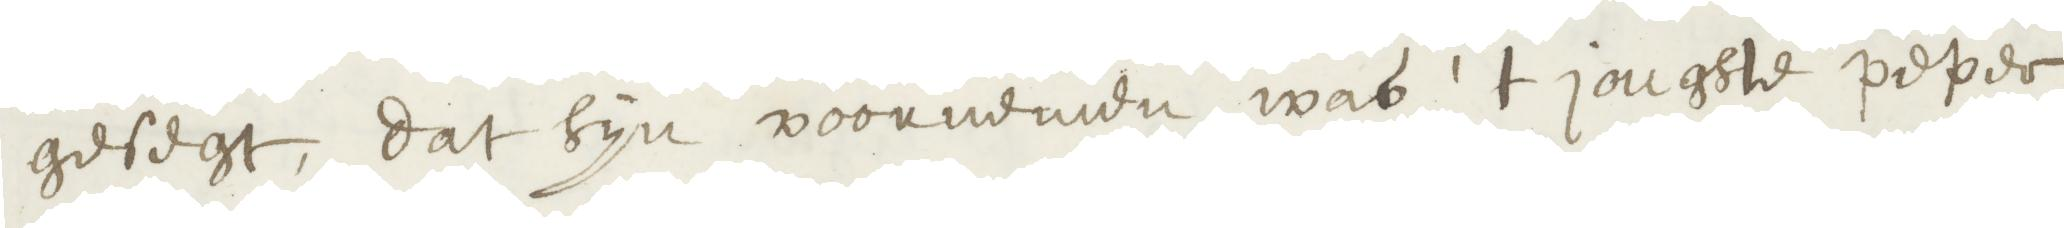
gesegt, dat sijn voornemen was ’t jongste peper
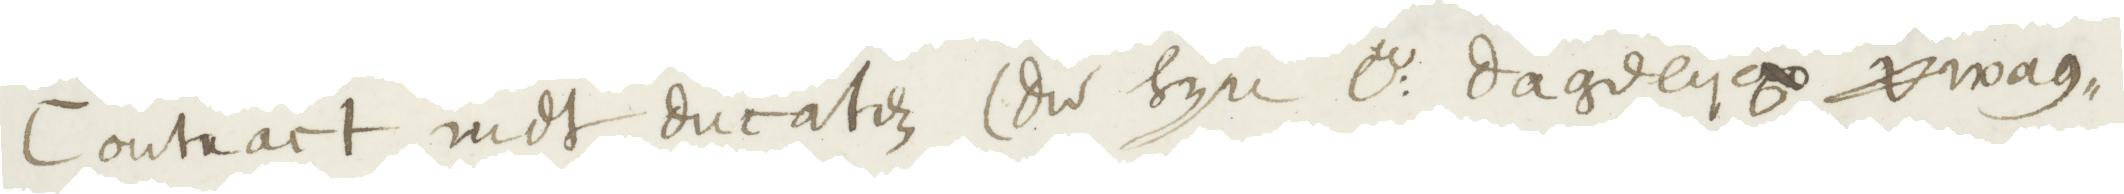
Contract met ducaten (die sijn E: dagelijcx verwag„
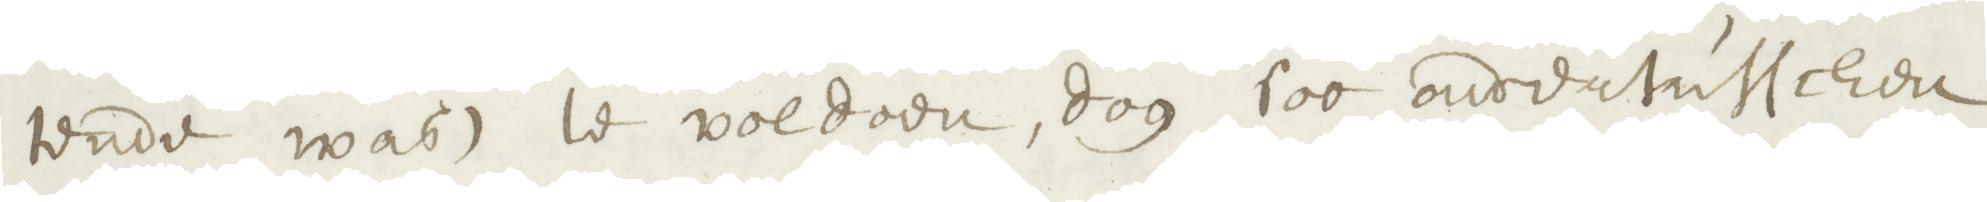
tende was) te voldoen, dog soo ondertusschen
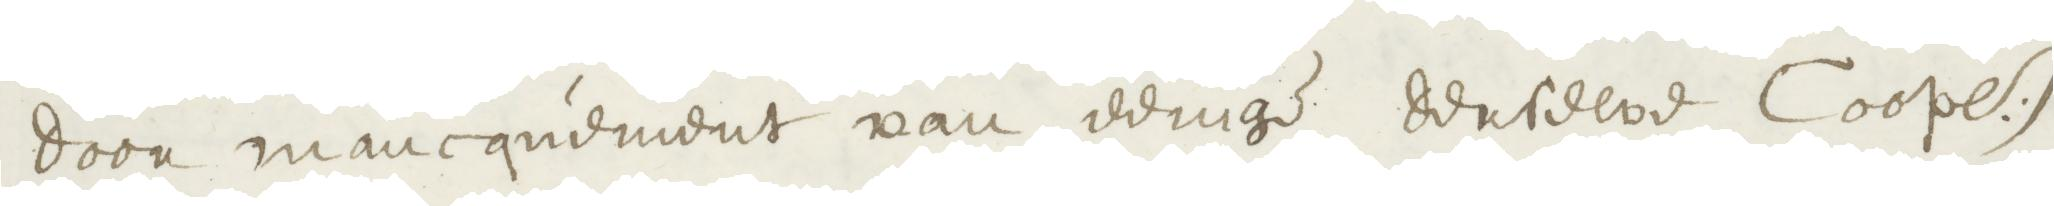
door mancquement van eenige derselve Coopl:
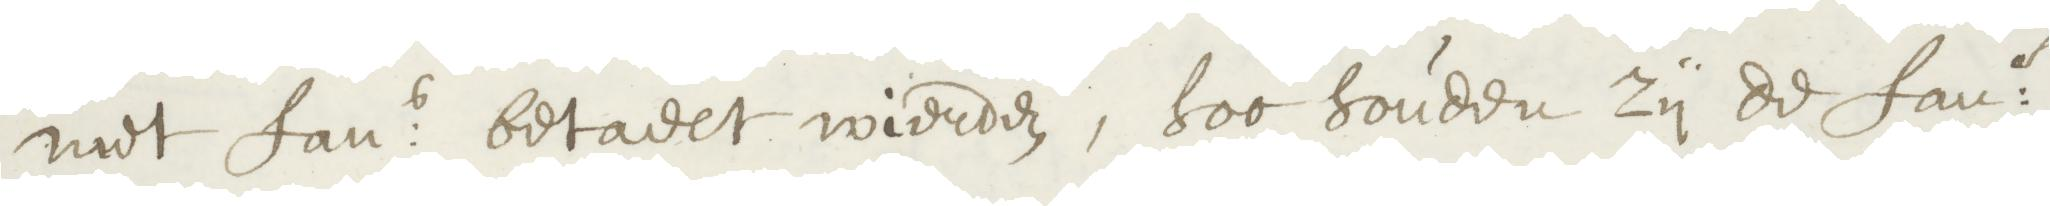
met fan:s betaelt wierden, soo souden zij de fan:s
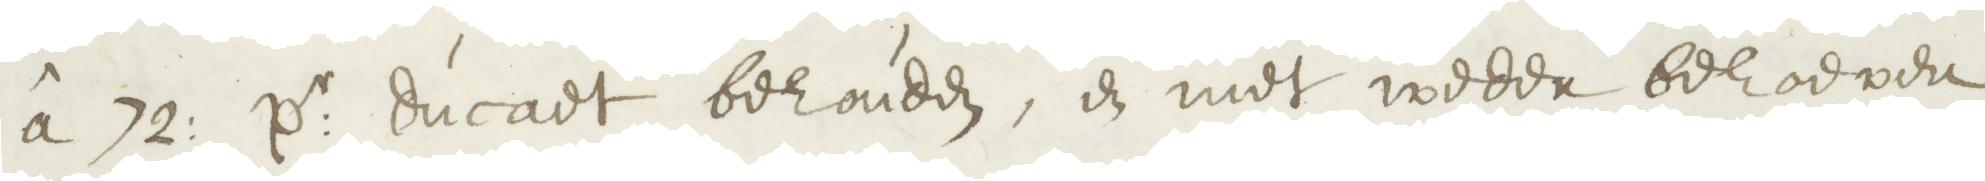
â 72: p:r ducaet behouden, en niet weder behoeven
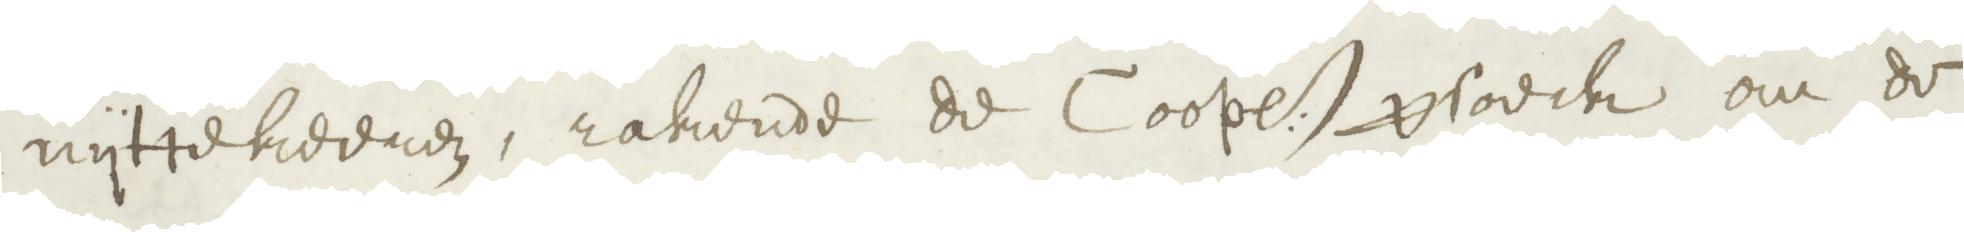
uijttekeeren, rakende de Coopl: versoeck om de
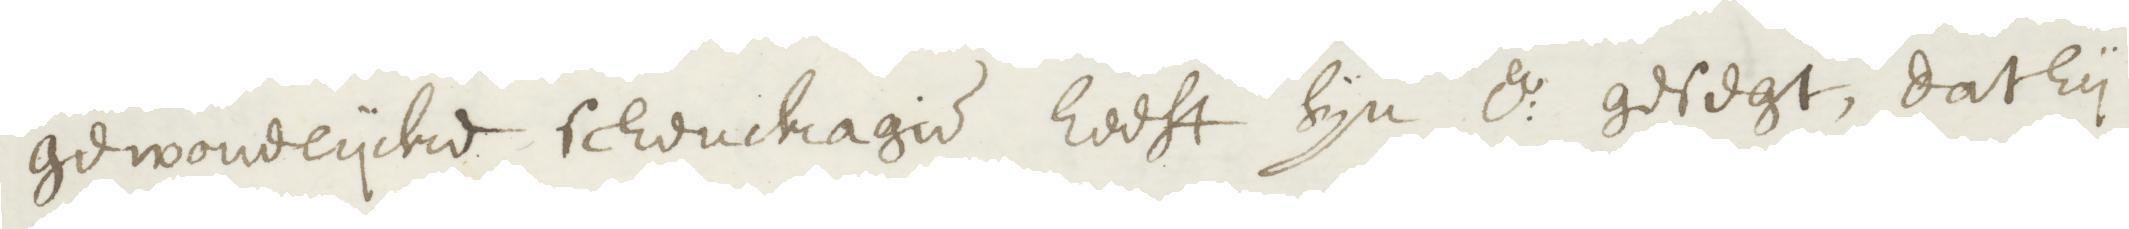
gewonelijcke schenckagie heeft sijn E: gesegt, dat hij
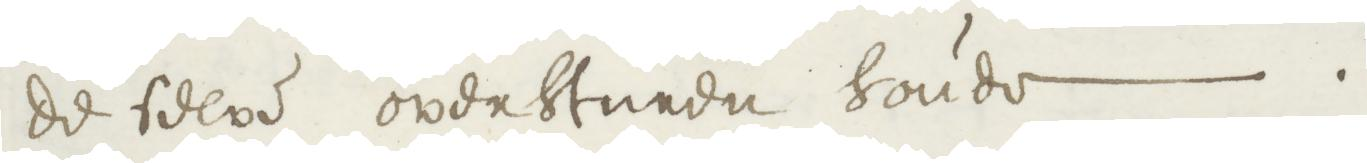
de selve oversturen soude.
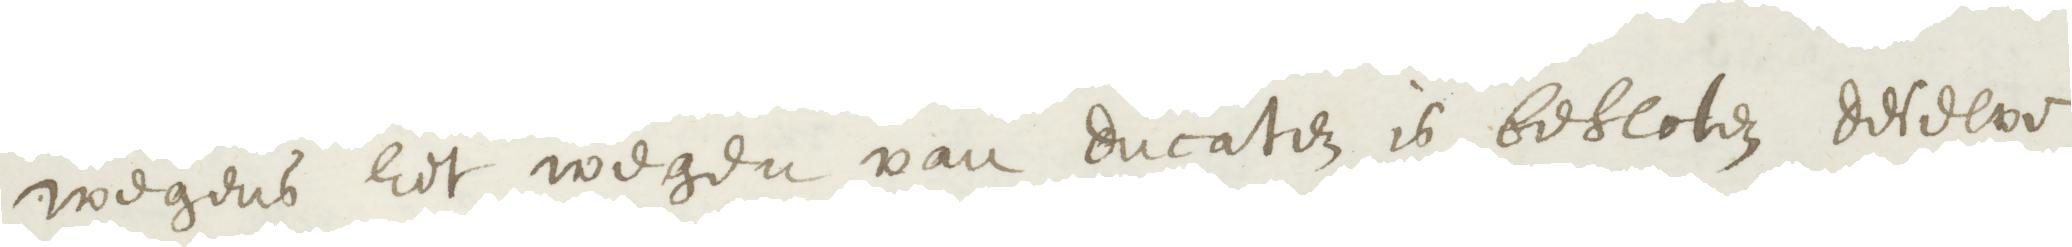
wegens het wegen van ducaten is besloten deselve
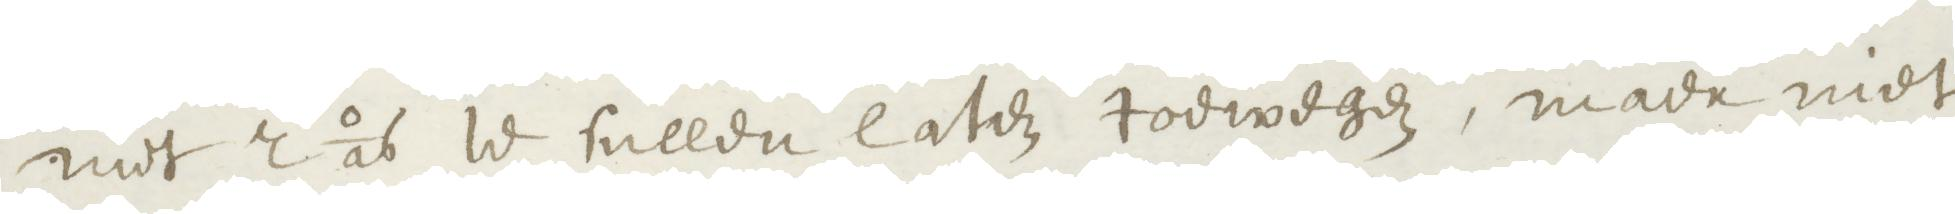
met ro/as te sullen laten toewegen, maer niet
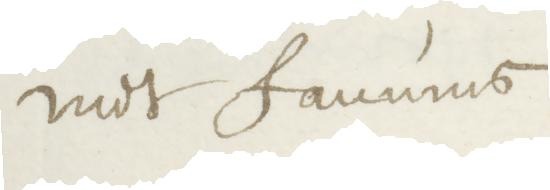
met fanums
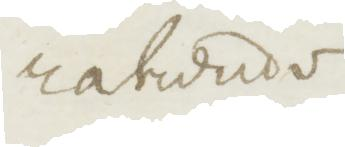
rakende
